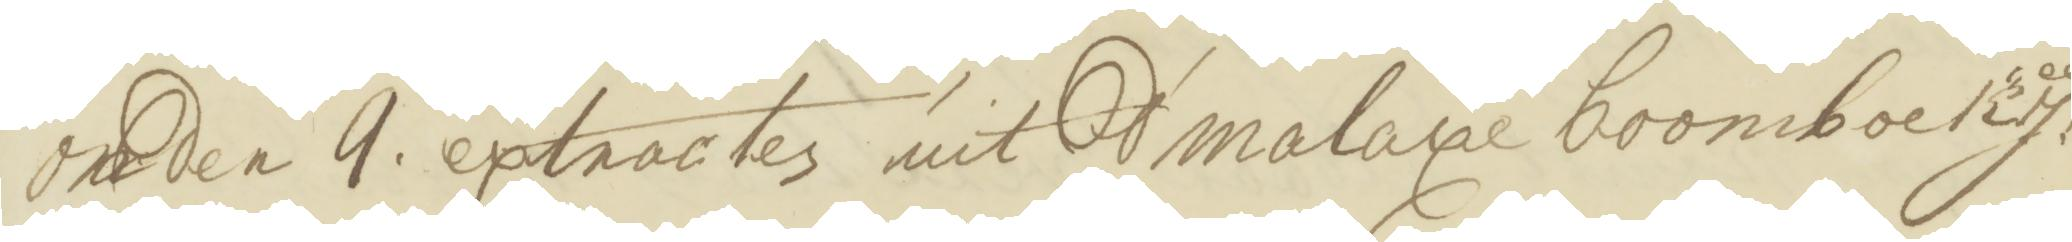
onder 4. extracten uit d’malaxe boomboekes;
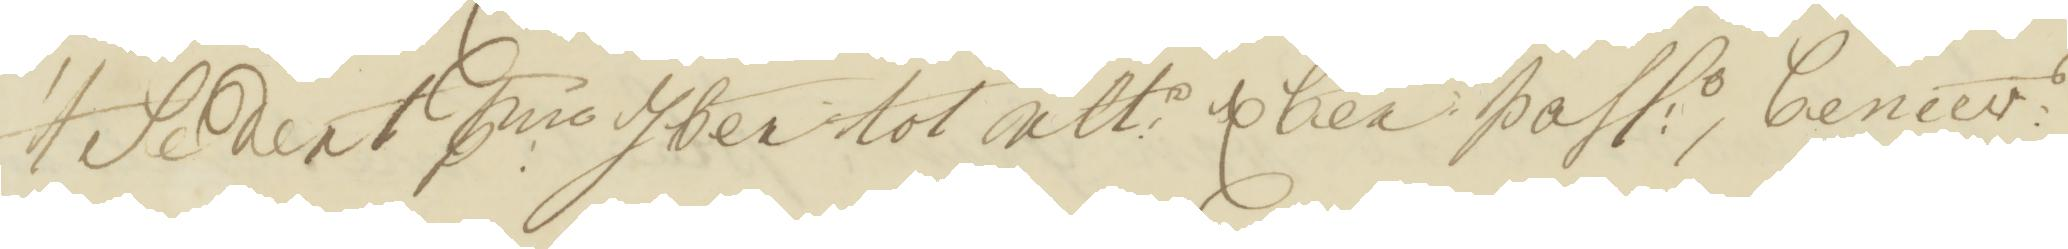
’t Seder p:mo 7ber tot ult:o xber: pass:o, beneev:s
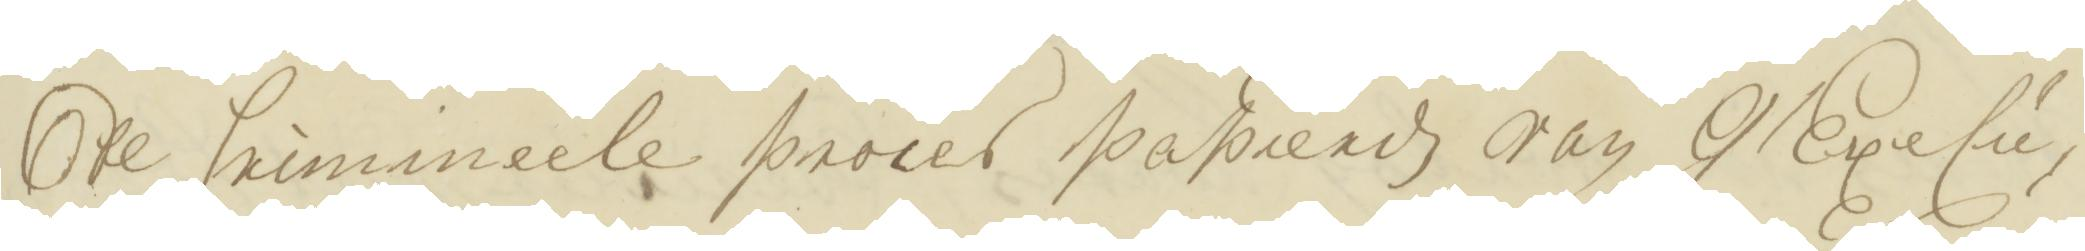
de Crimineele proces papieren van g'Execu„
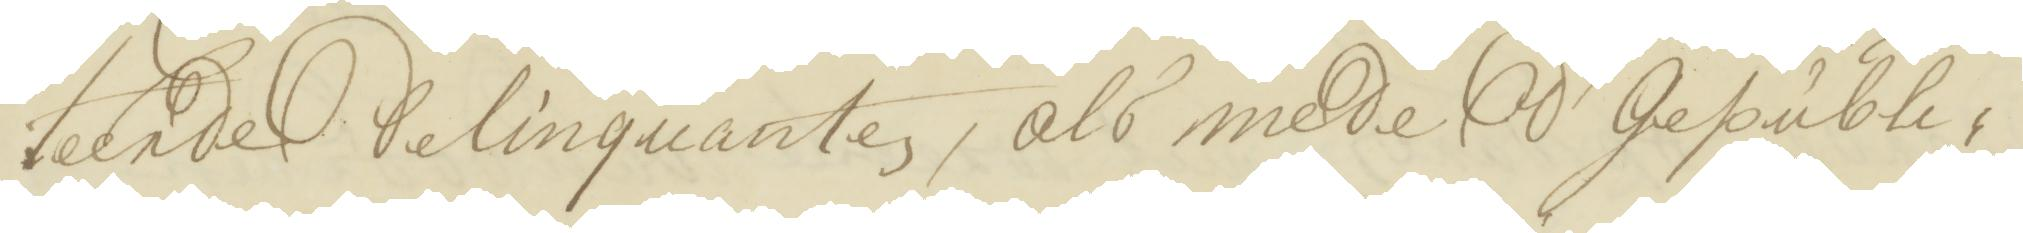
teerde delinquanten, als mede d’ Gepubli„
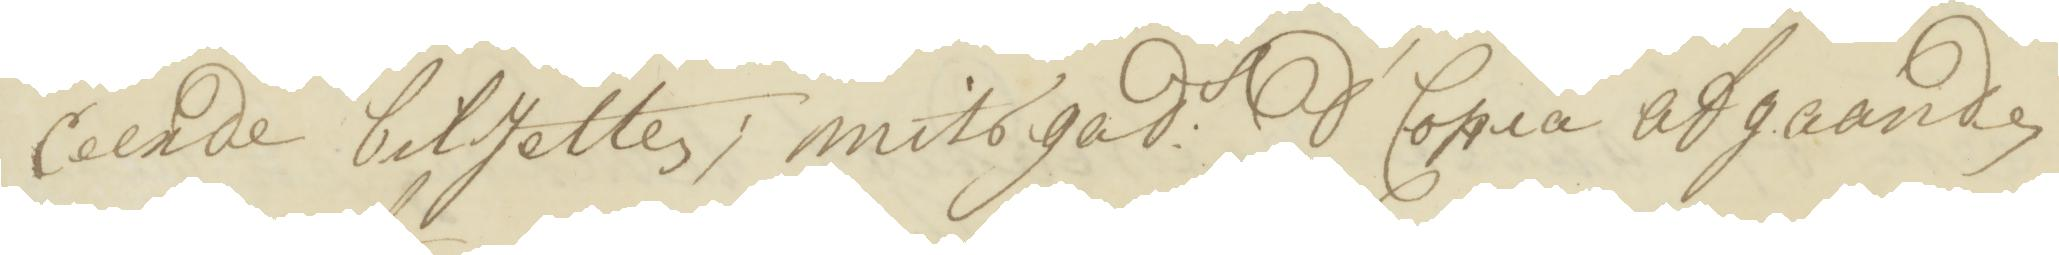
ceerde biljetten, mitsgad:s d’ Copia afgaande
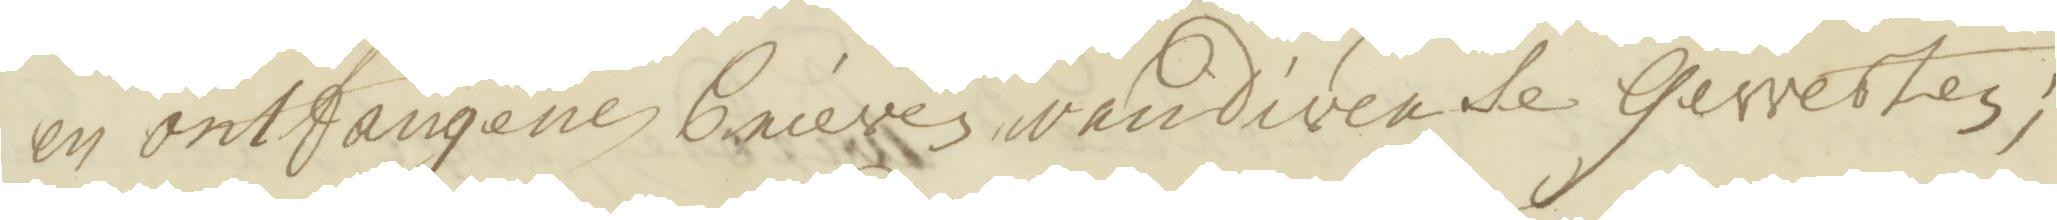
en ontfangene brieven, van diverse gewesten;
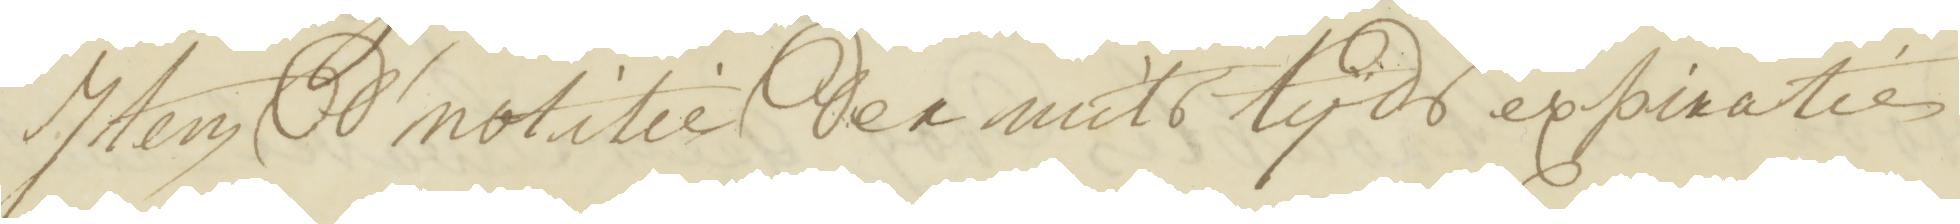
Jtem d’ notitie der mits tijds expiratie
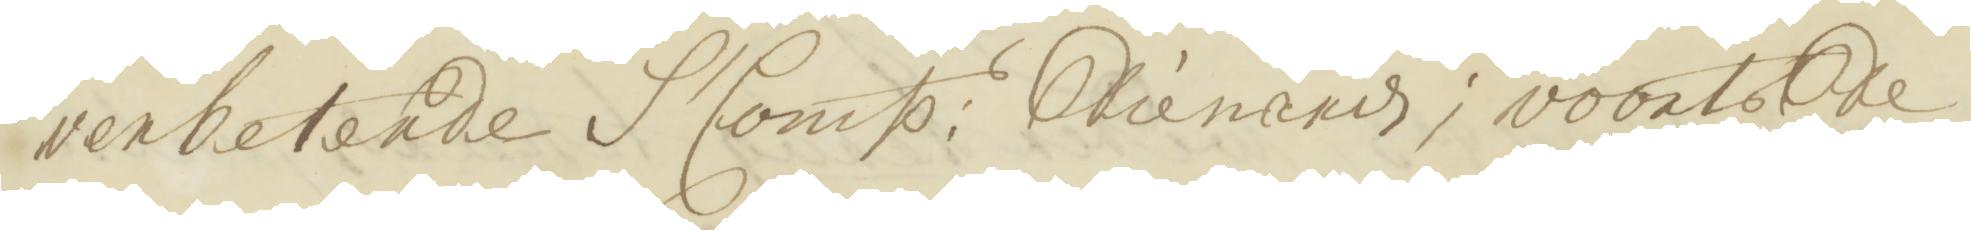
verbeterde S'Comp:s dienaren; voorts de
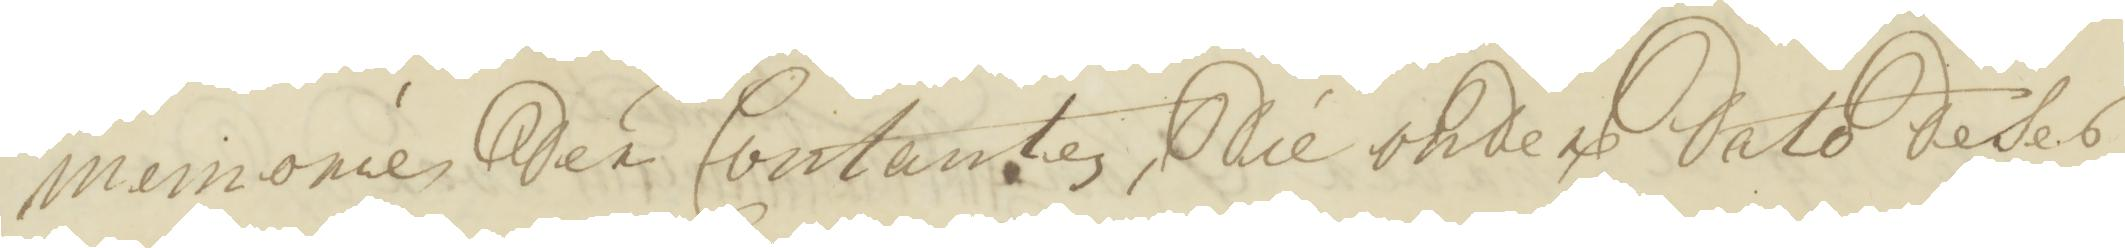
memorie der Contanten, die onder dato deses
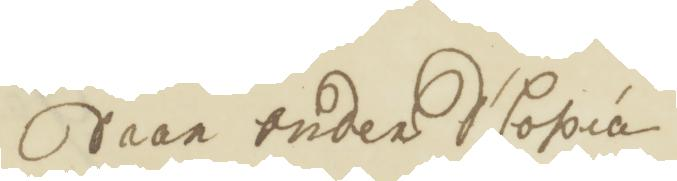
daar onder d'Copia
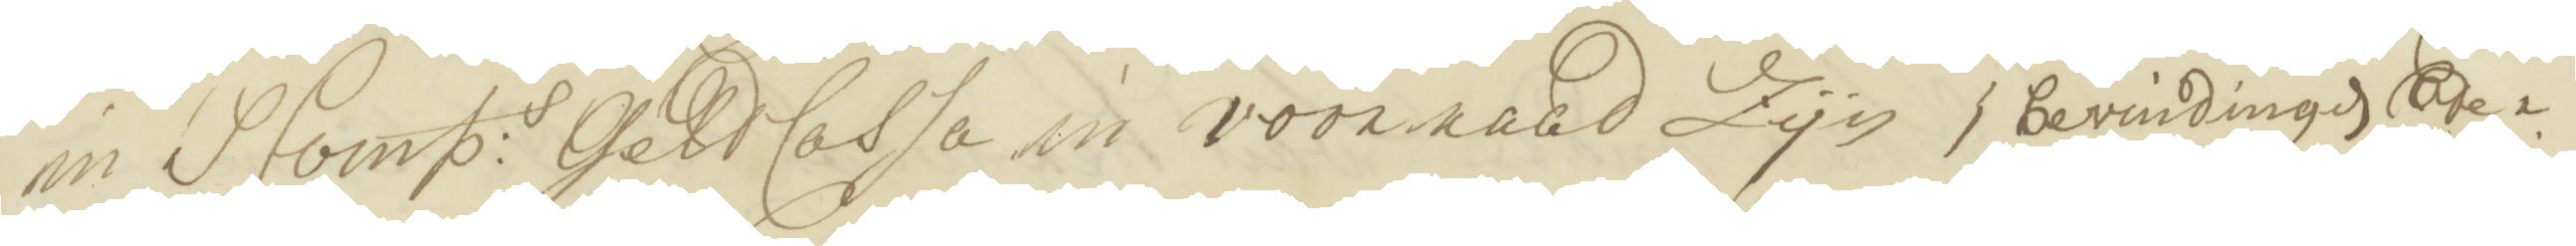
in ’S Comp:s geld Cassa in voorraad Zijn / bevindingen der
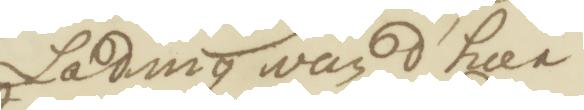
Lading van d’ hier
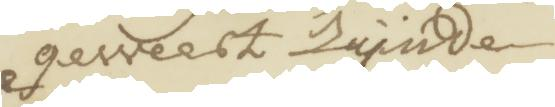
geweest Zijnde
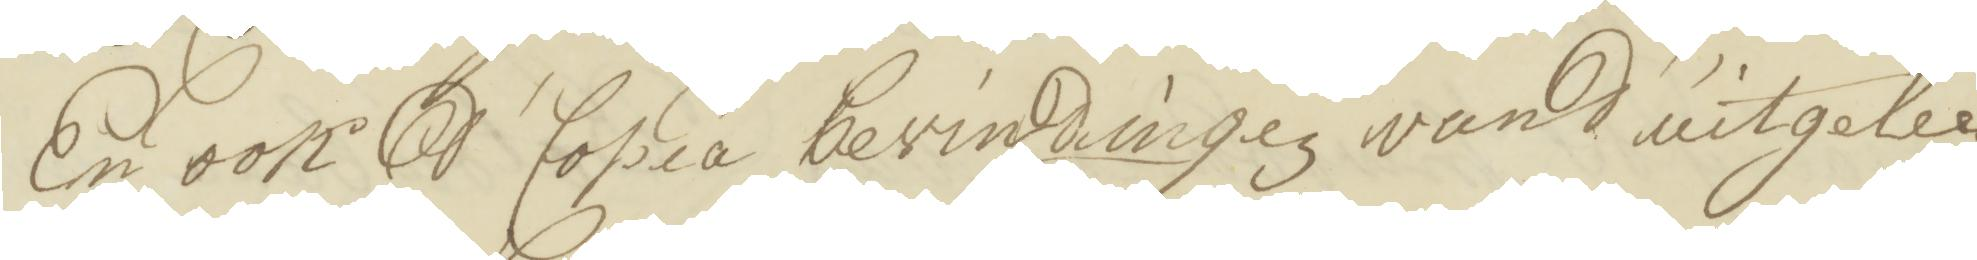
En ook d' Copia bevindingen van d uitgelee,,
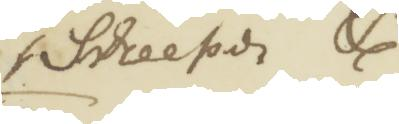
scheepen &:ra
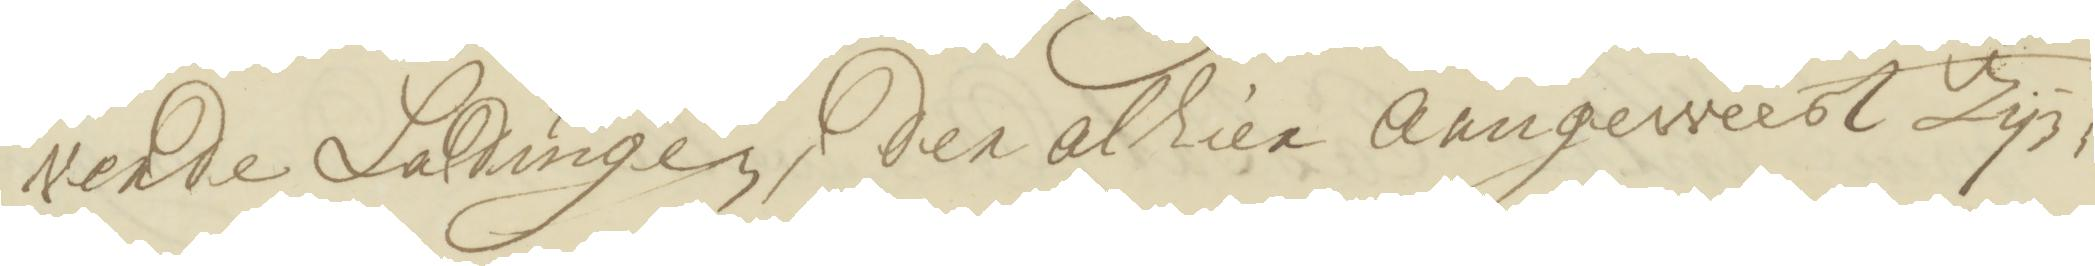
verde Ladingen, der alhier aangeweest zijn,
